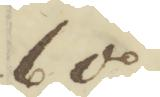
6 do
